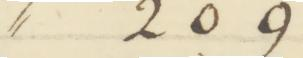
„ 209
